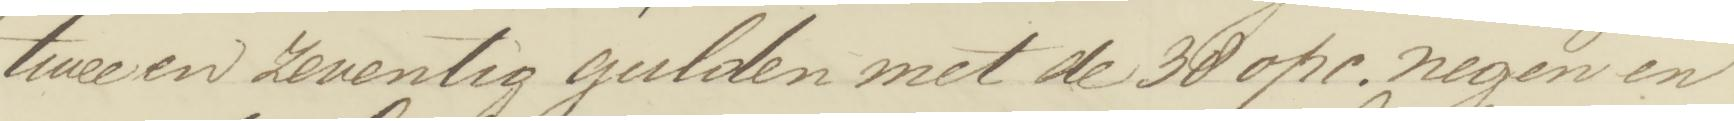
twee en zeventig gulden met de 38 opc. negen en
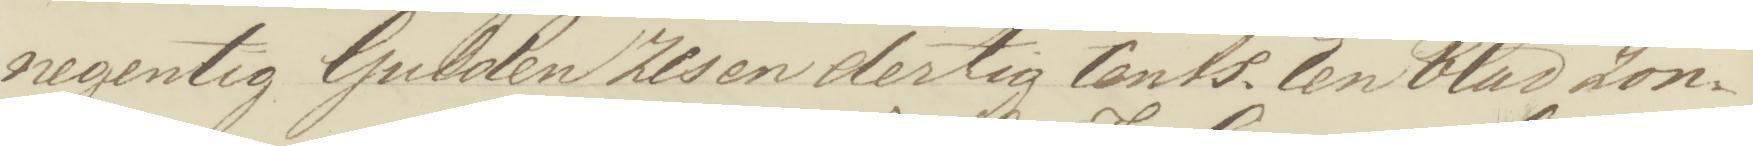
negentig Gulden zes en dertig Cents. Een blad zon„
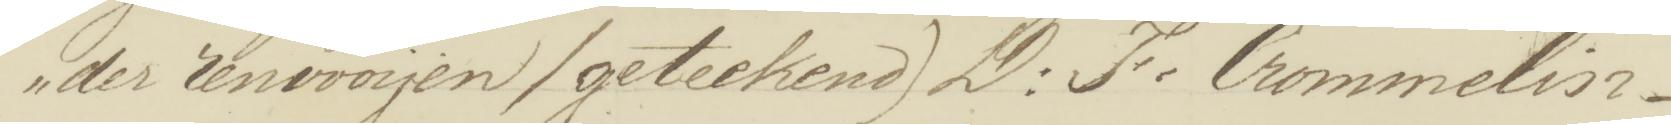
„der renvooijen /geteekend) D:F: Crommelin —
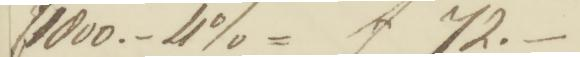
ƒ1800. — 4% = ƒ 72. —
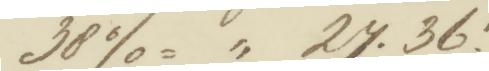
38% = „ 27. 36.
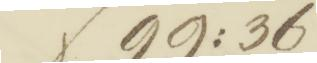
ƒ 99: 36
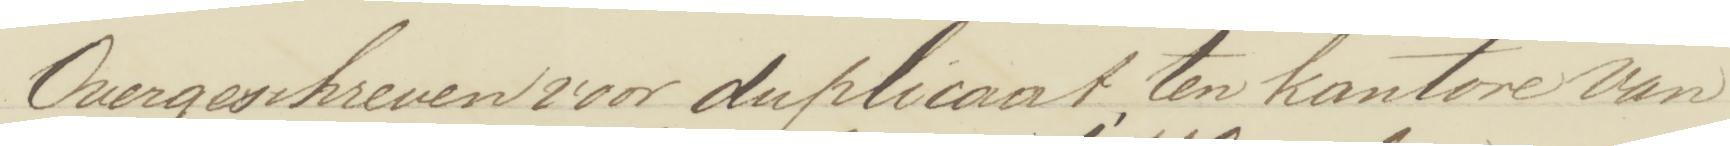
Overgeschreven voor duplicaat ten kantore van
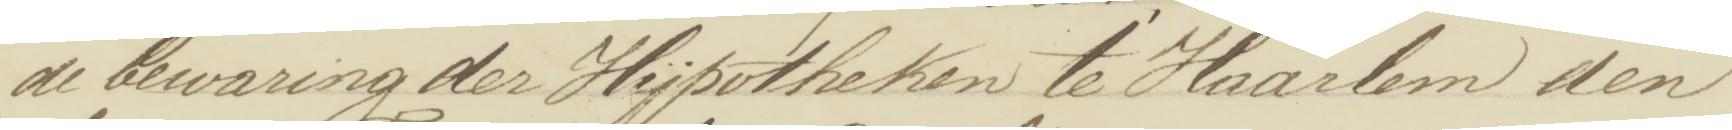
de bewaring der Hijpotheken te Haarlem den
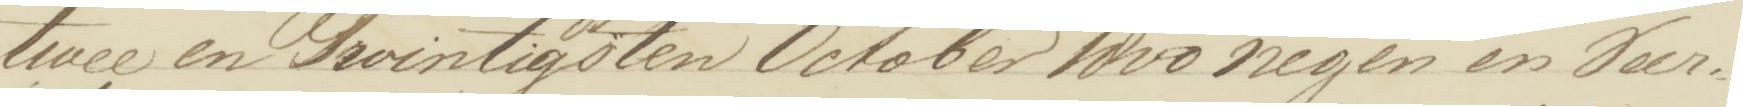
twee en Twintigsten October 1800 negen en Veer„
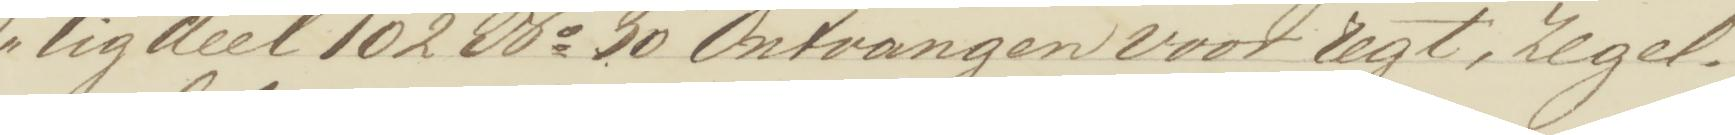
tig deel 102 N=o 30 Ontvangen voor Regt, zegel,
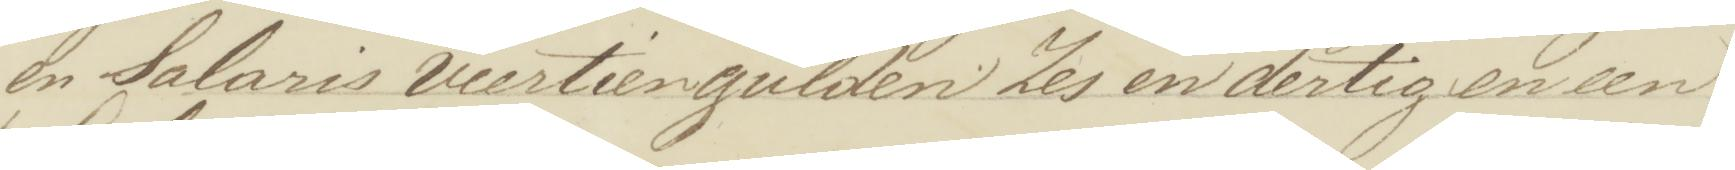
en Salaris veertien gulden Zes en dertig en een
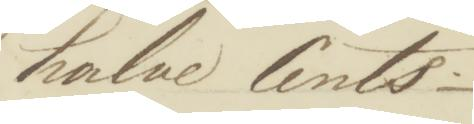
halve Cents. —
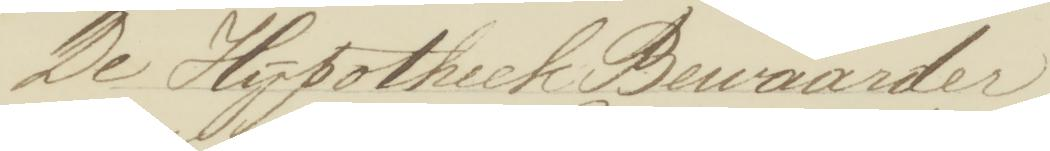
De Hijpotheek Bewaarder
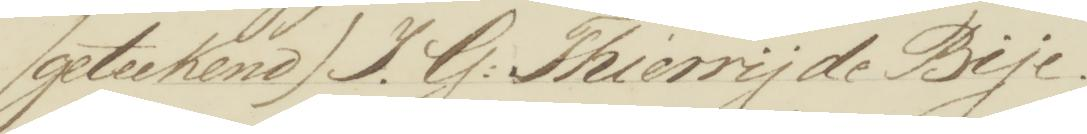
/geteekend) J. G: Thierrij de Bije.
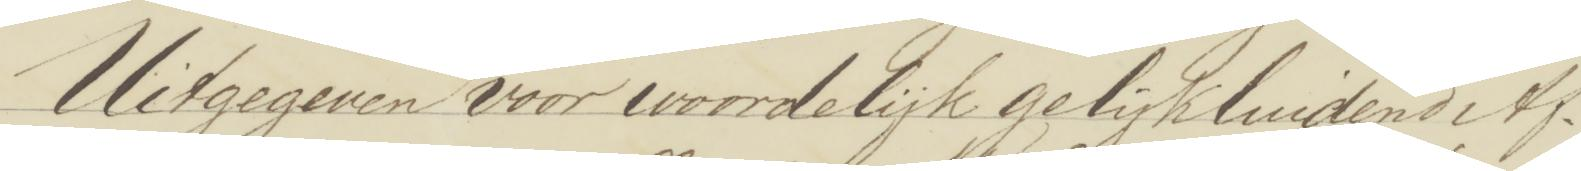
Uitgegeven voor woordelijk gelijkluidend Af„
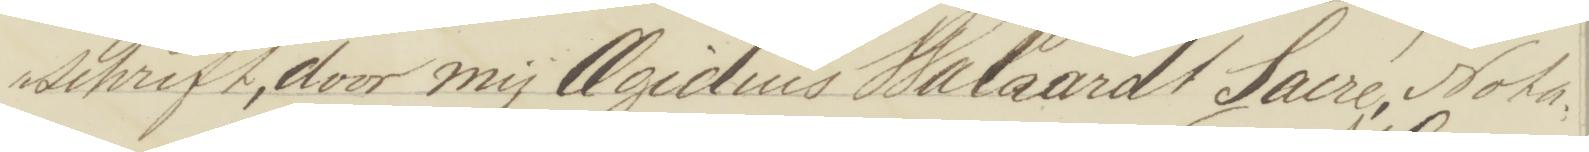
„schrift, door mij AEgidius Walaardt Sacré, Nota„
